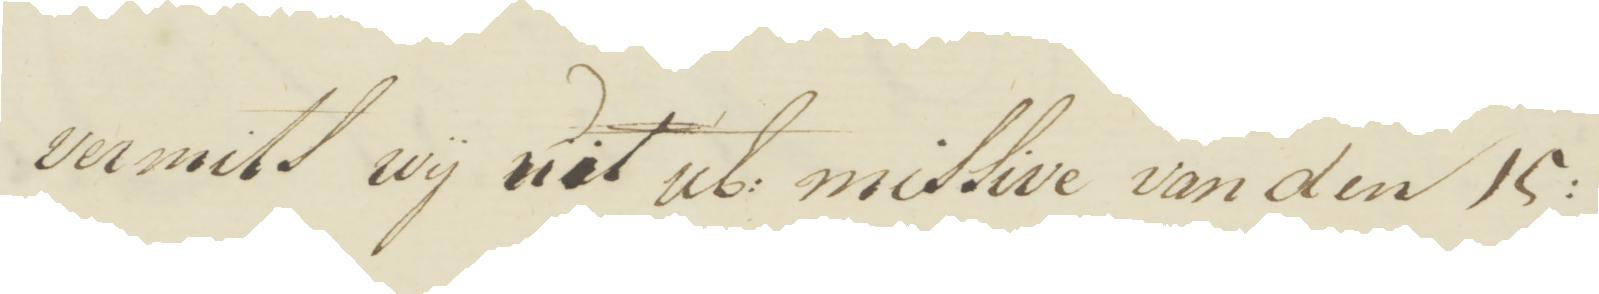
vermits wij uit uE: missive van den 15:
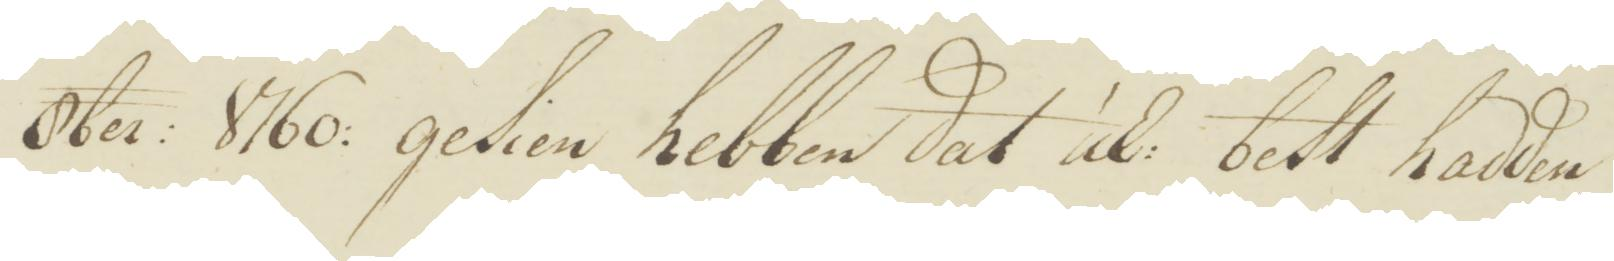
8ber: 1760: gesien hebben dat uE: best hadden
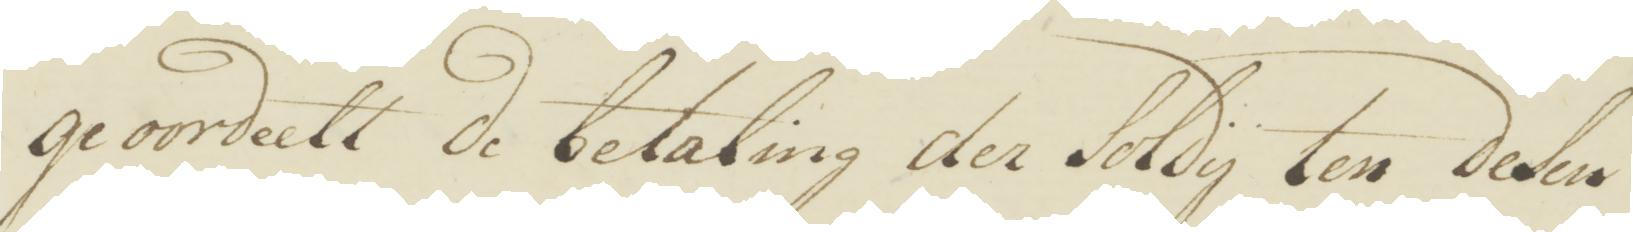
geoordeelt de betaling der soldij ten desen
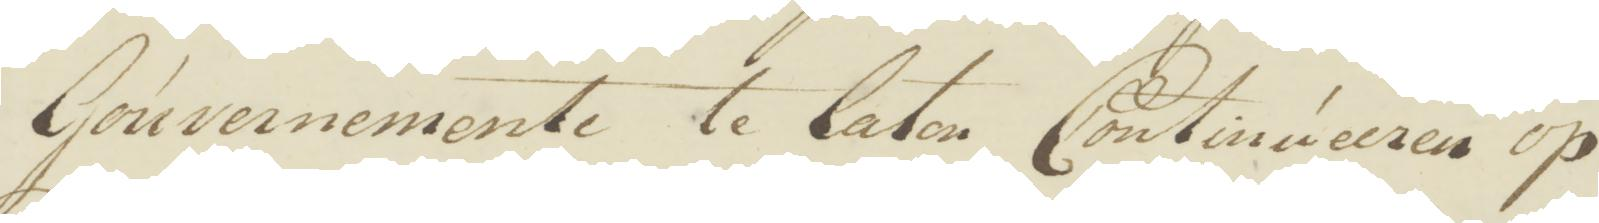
Gouvernemente te laten Continueeren op
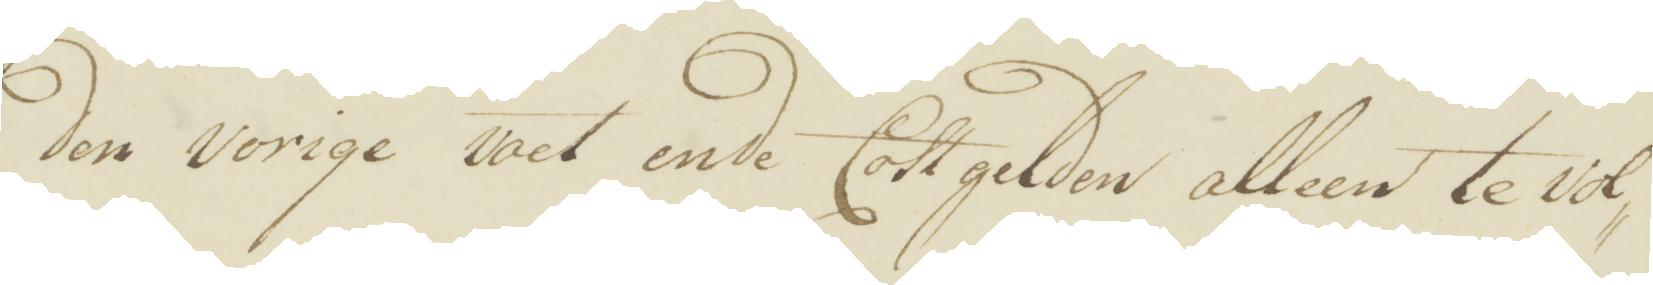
den vorige voet ende Cost gelden alleen te vol„
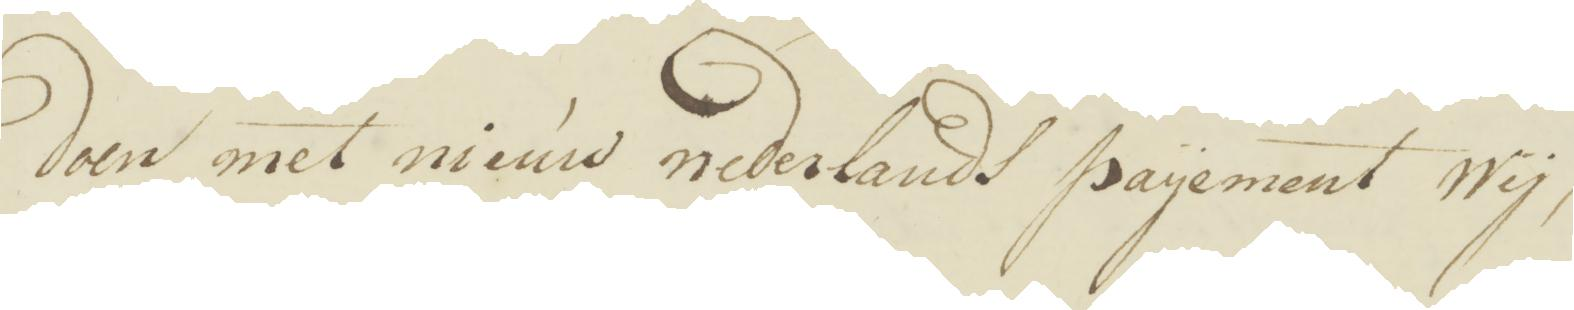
doen met nieuw nederlands paijement wij,
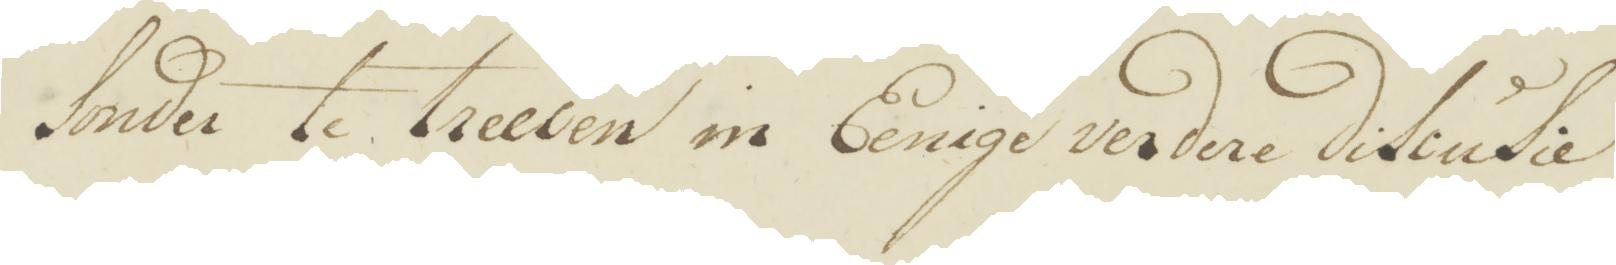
sonder te treeden in Eenige verdere discusie
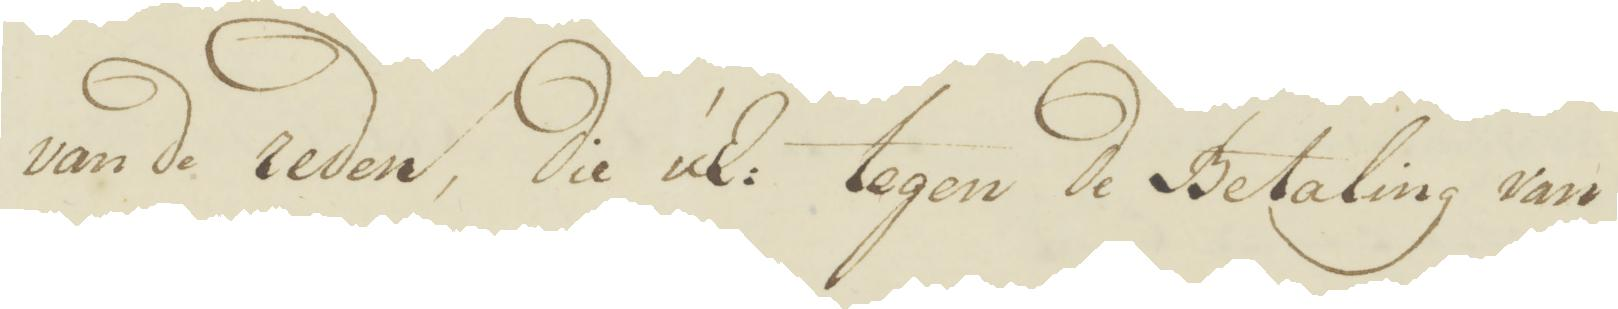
van de reden, die uE: tegen de Betaling van
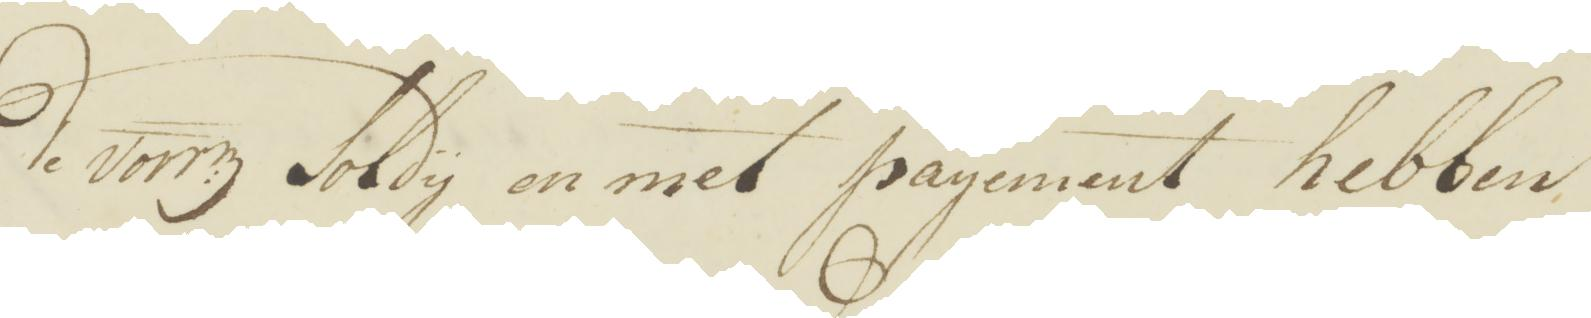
de voor:m soldij en met paijement hebben
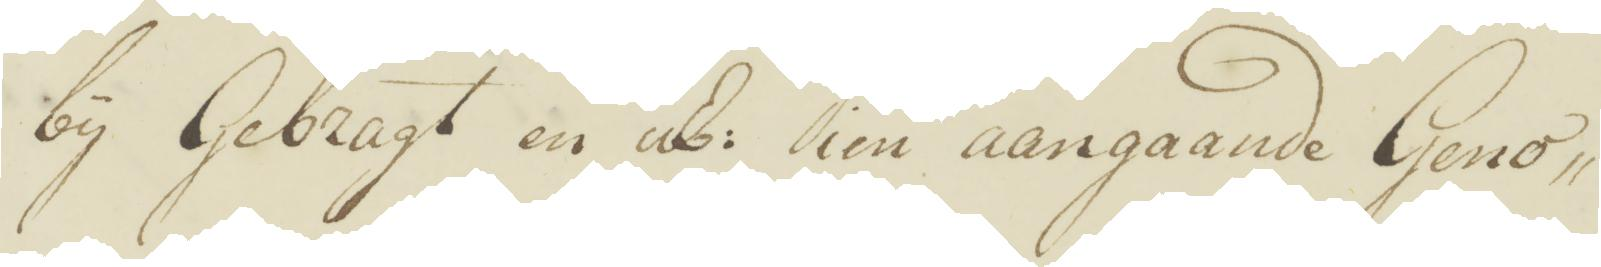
bij Gebragt en uE: dien aangaande Geno„
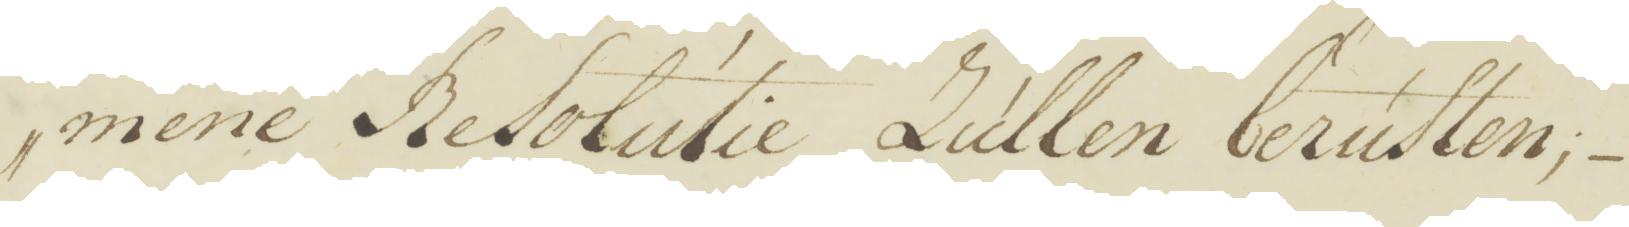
„mene Resolutie zullen berusten;-
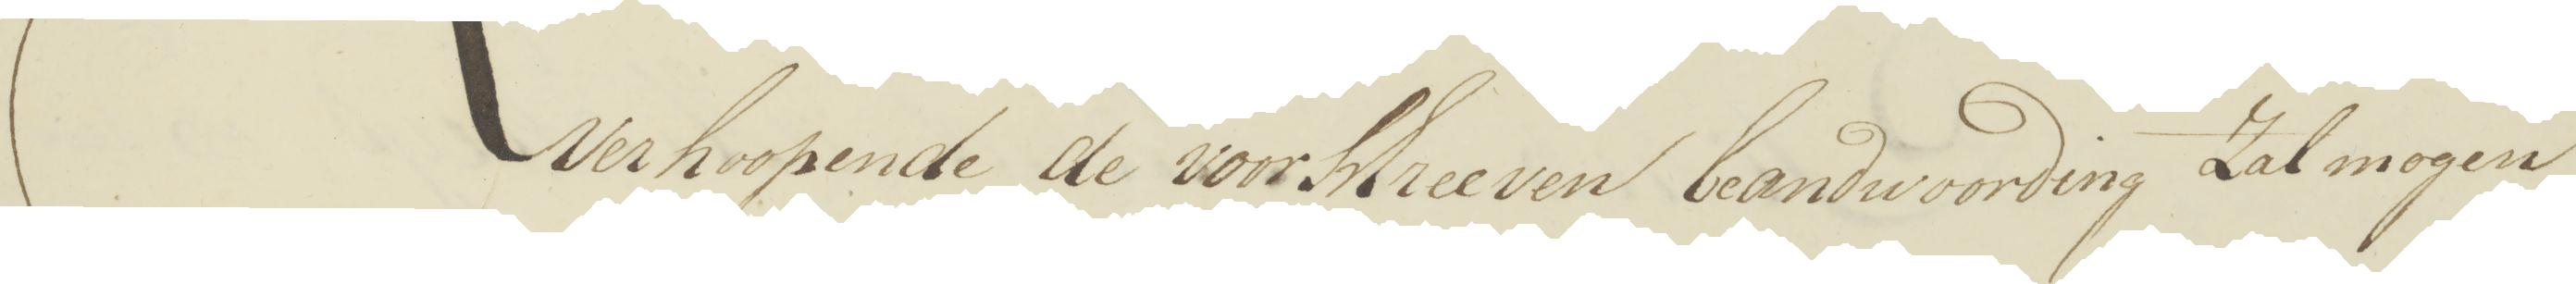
Verhoopende de voorschreeven beandwoording zal mogen
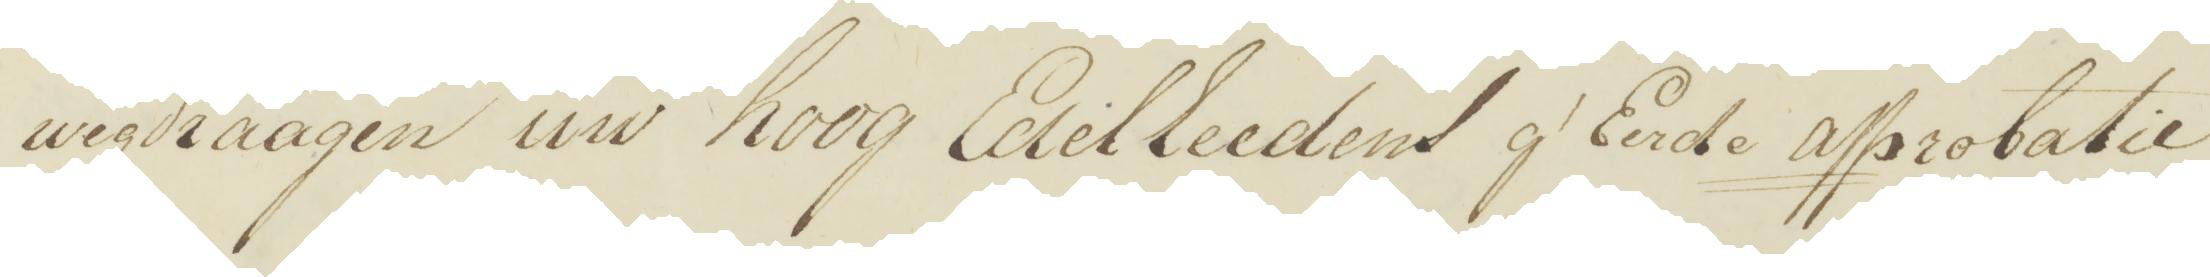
wegdraagen uw hoog Edelheedens g’Eerde approbatie
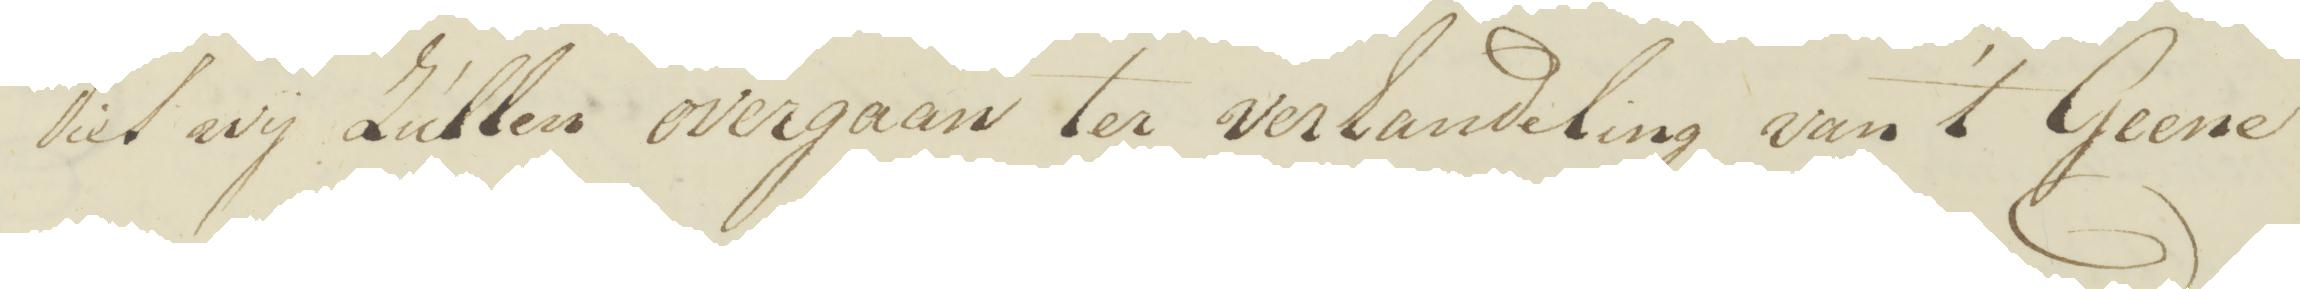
dies wij zullen overgaan ter verhandeling van ’t Geene
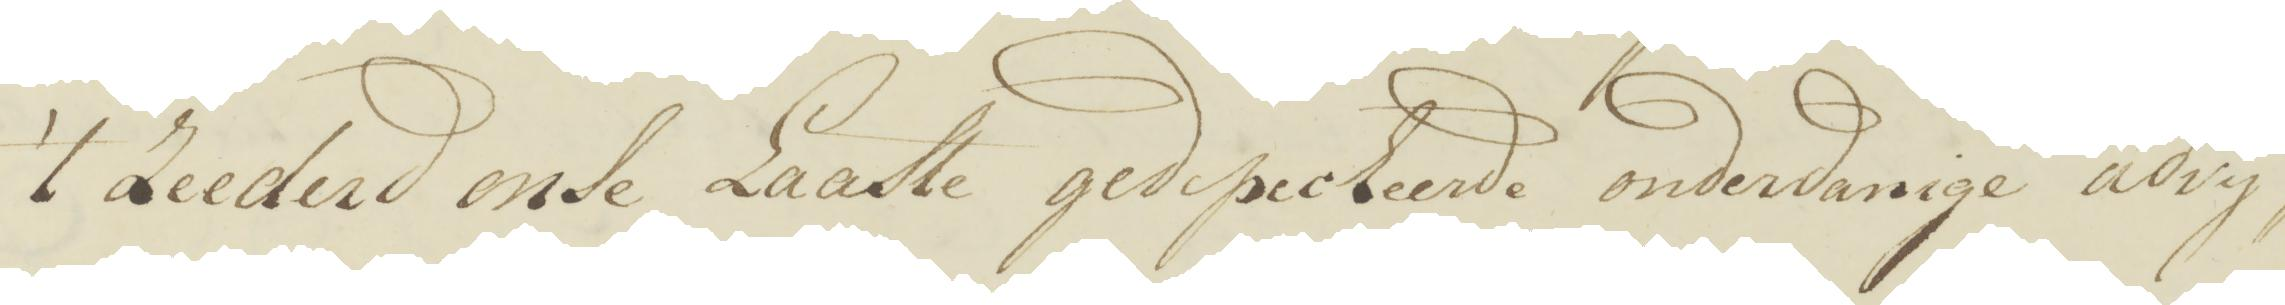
’t zeederd onse Laaste gedepecheerde onderdanige advij
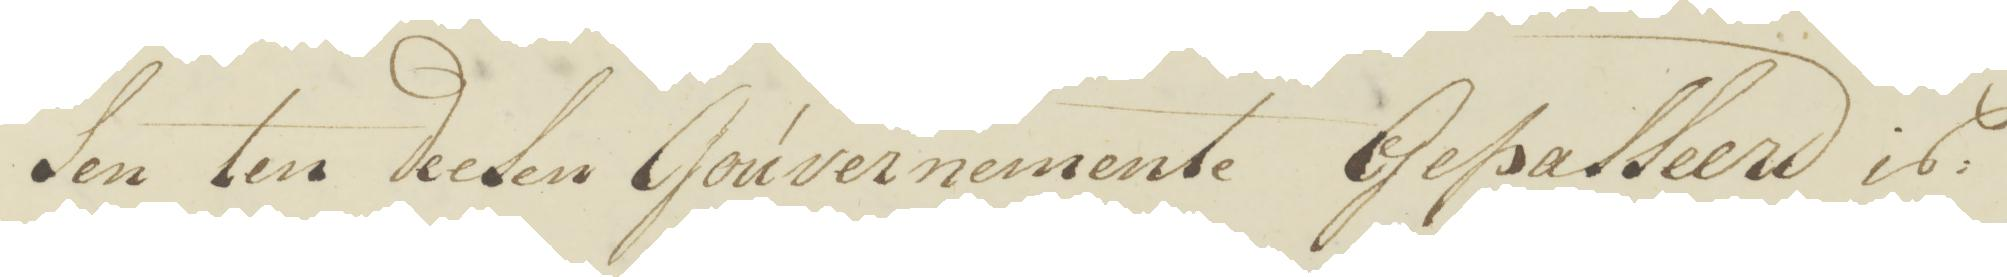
sen ten deesen Gouvernemente Gepasseerd is:
